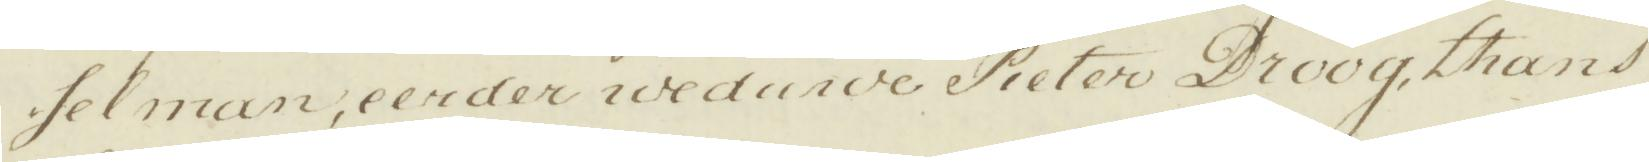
„selman, eerder weduwe Pieter Droog, thans
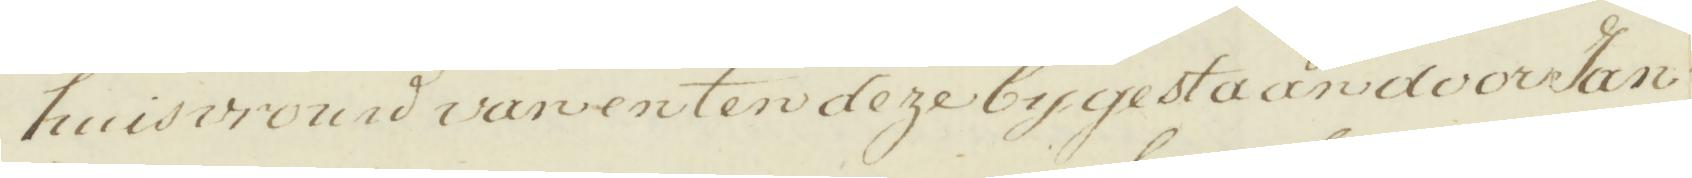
huisvrouw van en ten deze bygestaan door Ian
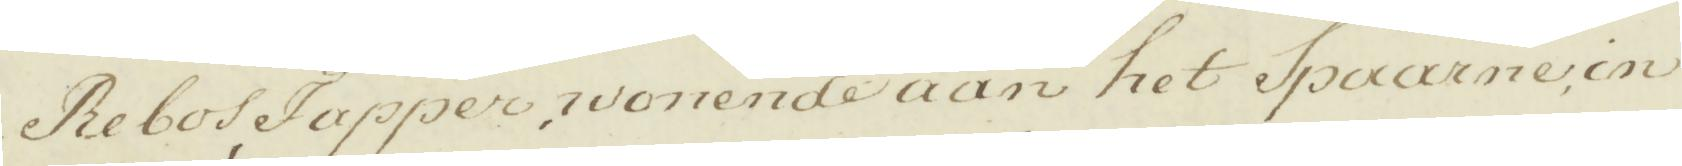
Rebos, Tapper, wonende aan het Spaarne, in
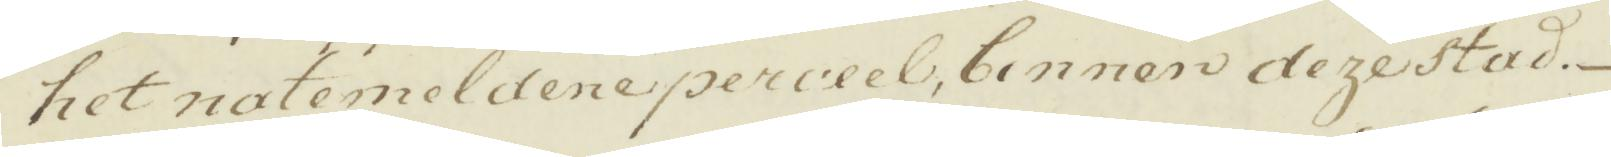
het natemeldene perceel, binnen deze stad.
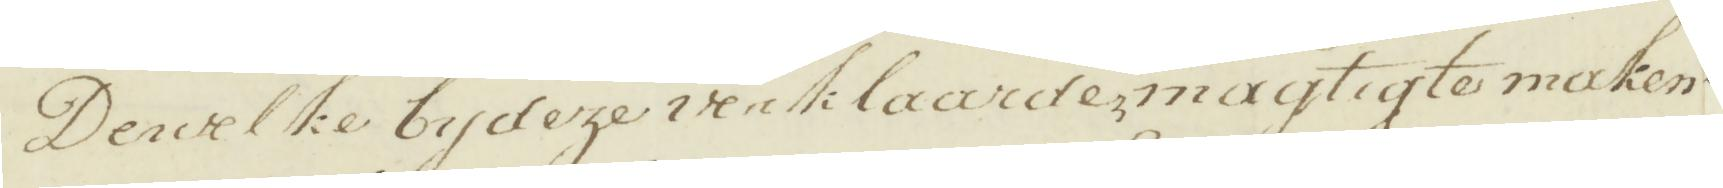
Dewelke by deze verklaarden magtig te maken
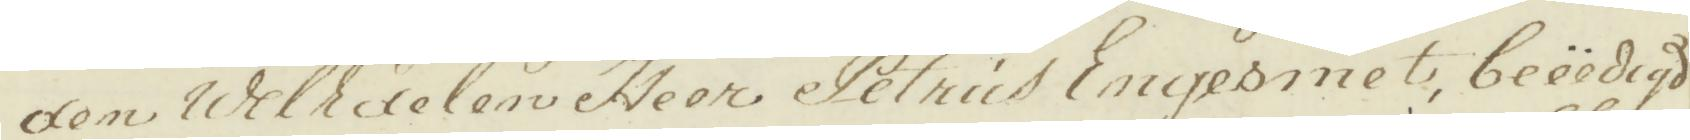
den Wel Edelen Heer Petrus Engesmet, beëedigd
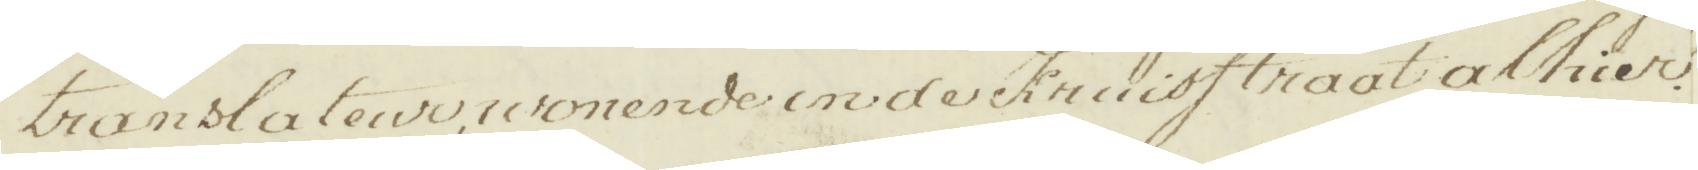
translateur, wonende in de Kruisstraat alhier
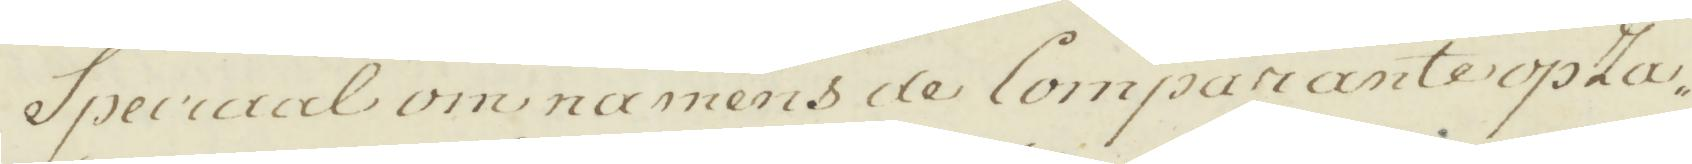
speciaal om namens de Comparante op Za„
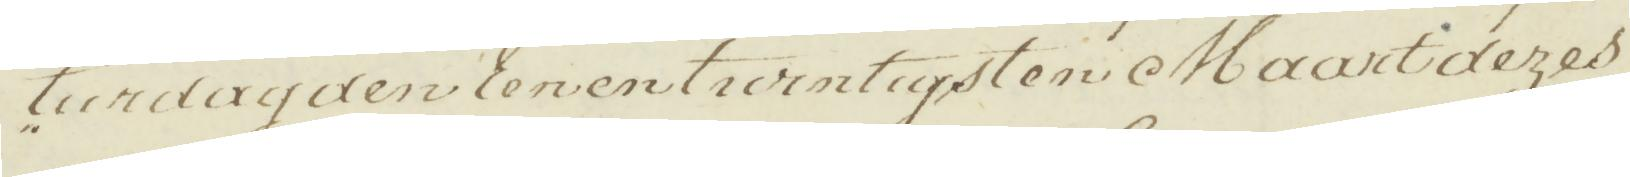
„turdag den Een en twintigsten Maart dezes
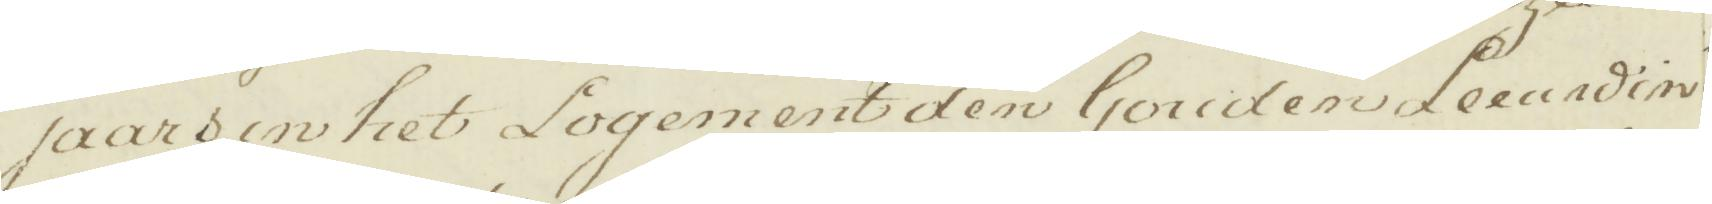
jaars in het Logement den Gouden Leeuw in
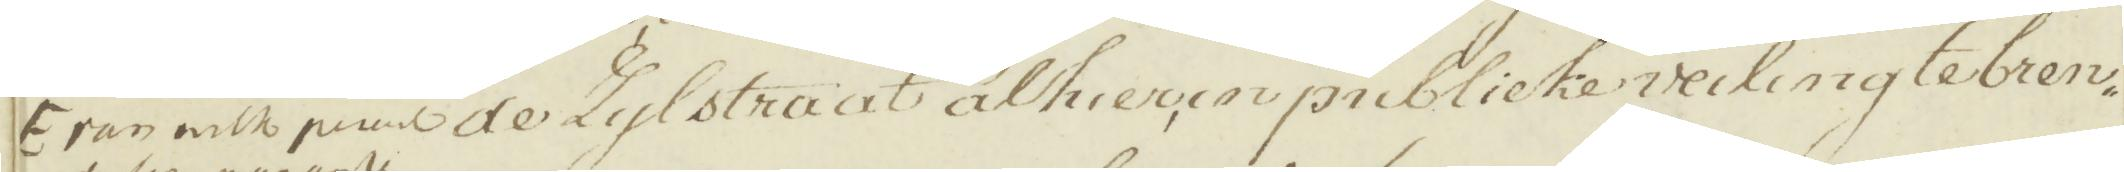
E van welk percent de Zylstraat alhier in publieke veiling te bren„
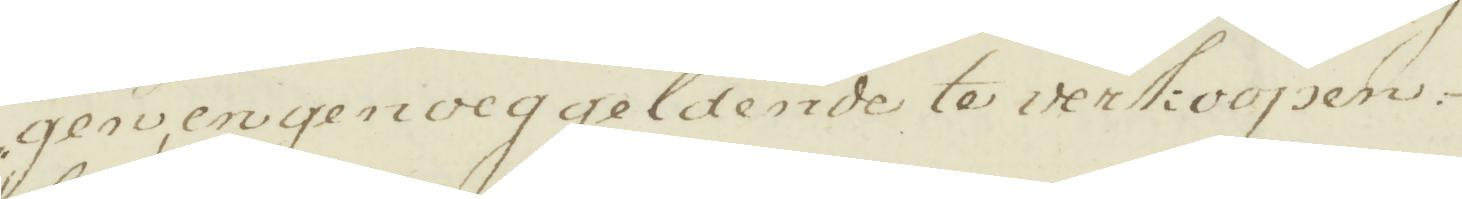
„gen, en genoeg geldende te verkoopen.
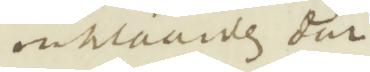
verklaarden dat
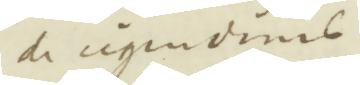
de eigendoms
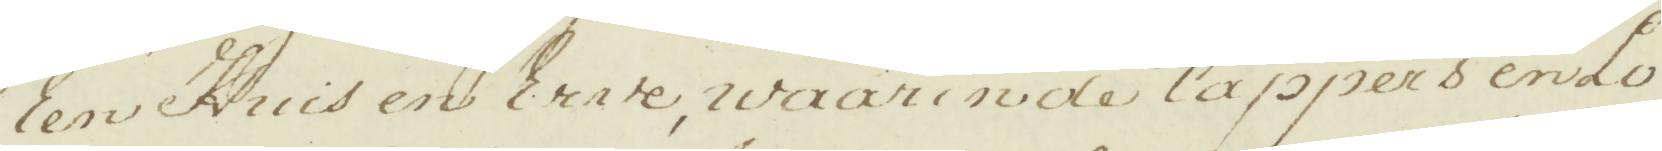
Een Huis en Erve, waarin de tappers en Lo
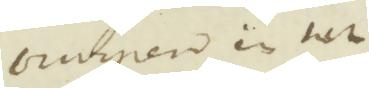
bewyzen in het
